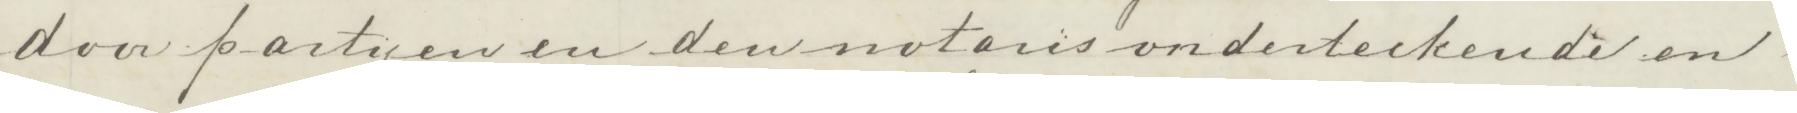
door partijen en den notaris onderteekende en
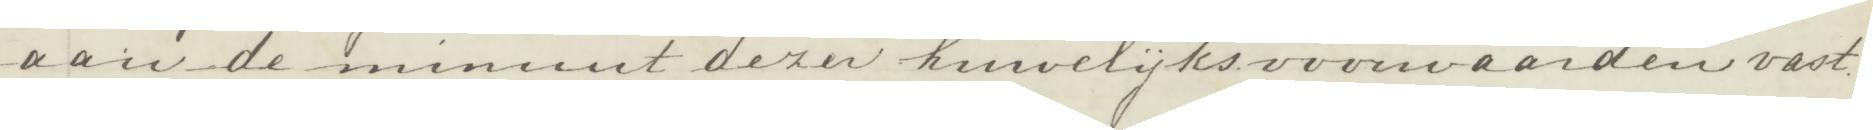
aan de minuut dezer huwelijksvoorwaarden vast
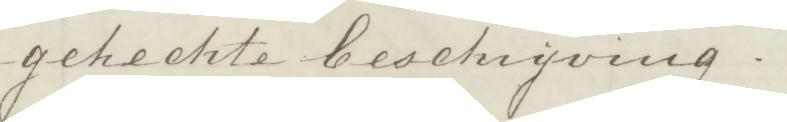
gehechte beschrijving.
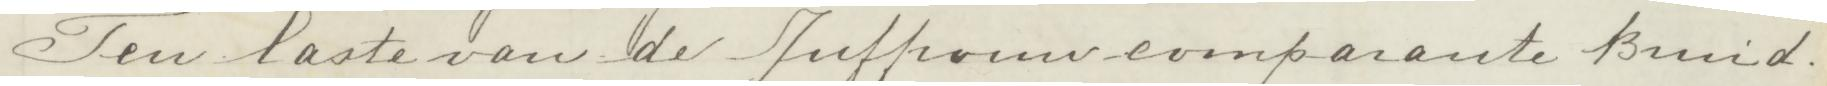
Ten laste van de Juffouw comparante Bruid.
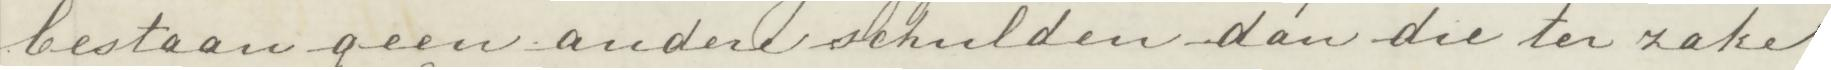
bestaan geen andere schulden dan die ter zake
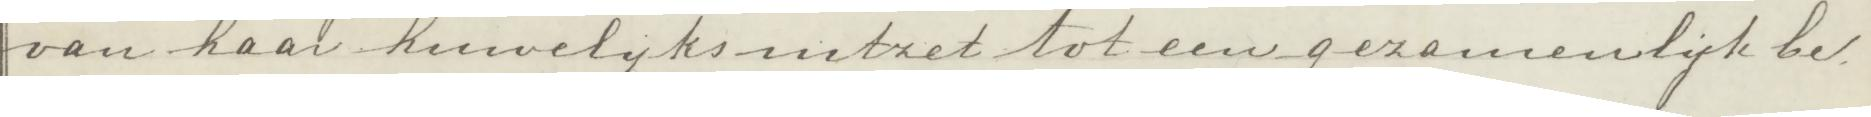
van haar huwelijks uitzet tot een gezamenlijk be„
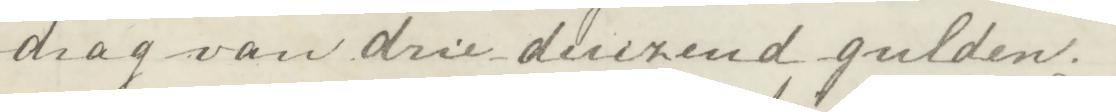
drag van drie duizend gulden.
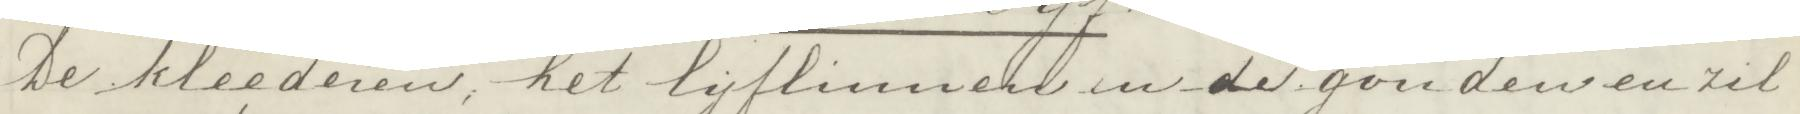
De kleederen, het lijflinnen en de gouden en zil
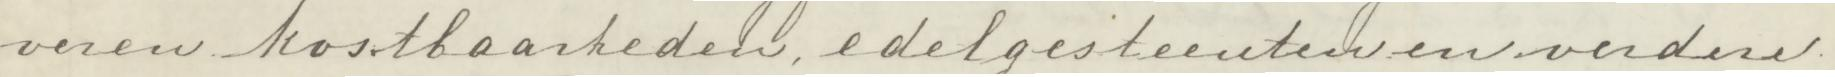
veren kostbaarheden, edelgesteenten en verdere
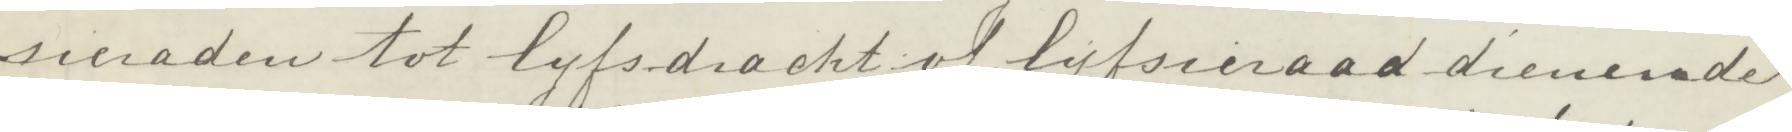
sieraden tot lyfsdracht of lijfsieraad dienende
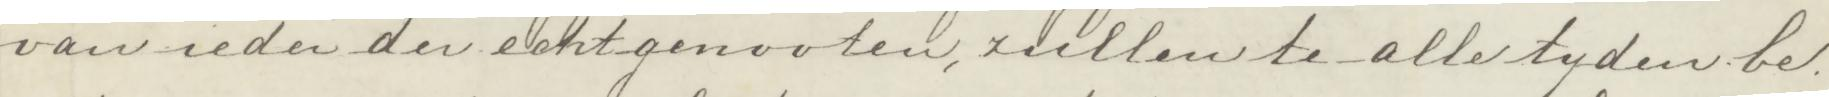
van ieder der echtgenooten, zullen te alle tyden be
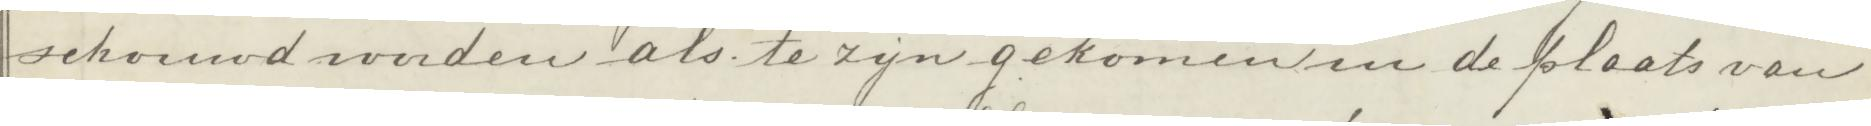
schouwd worden als te zijn gekomen in de plaats van
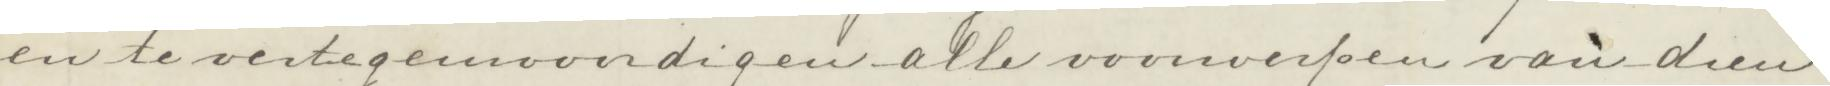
en te vertegenwoordigen alle voorwerpen van dien
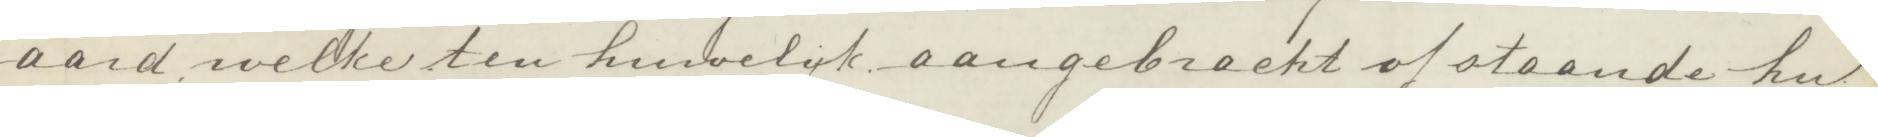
aard welke ten huwelijk aangebracht of staande hu
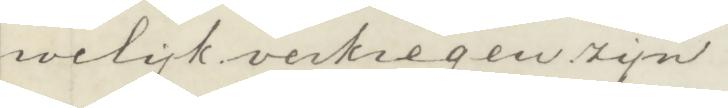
welijk verkregen zijn
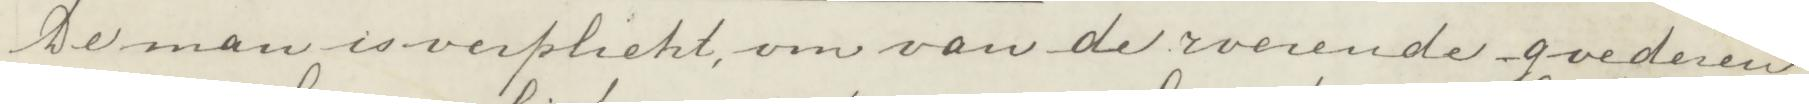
De man is verplicht, om van de roerende -goederen
